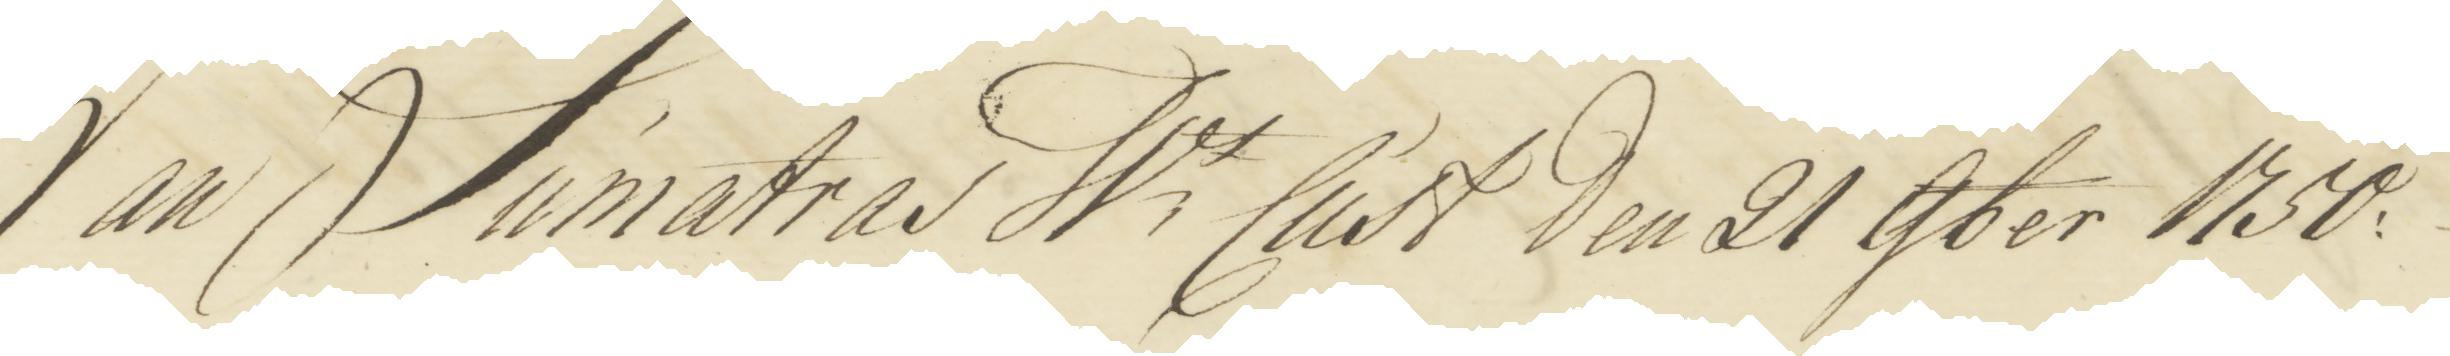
Van Sumatras W„t Cust den 21 9ber 1750:
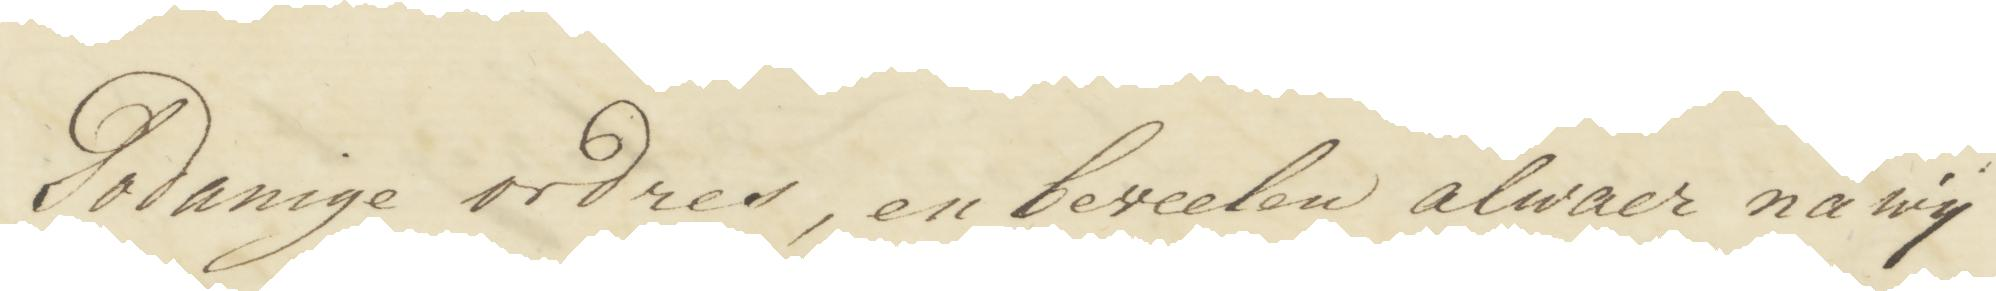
sodanige ordres, en beveelen alwaer na wij
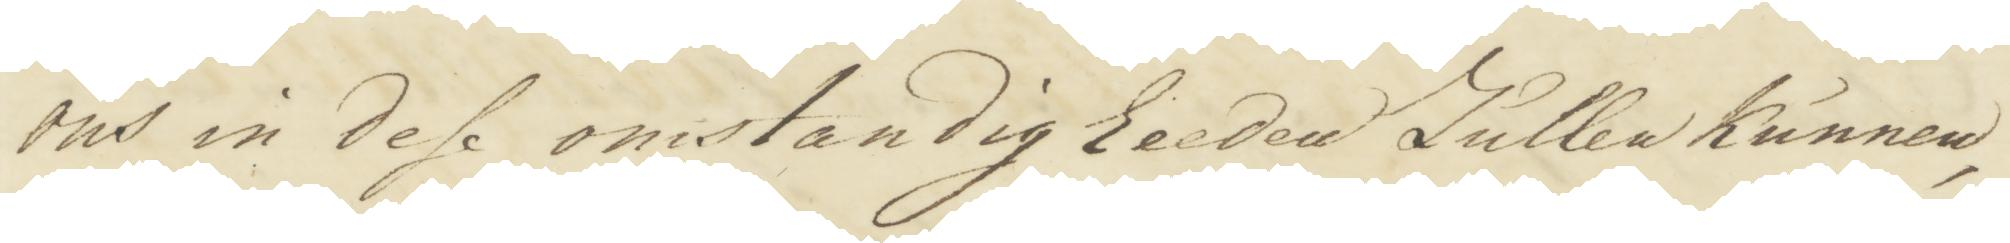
ons in dese omstandigheeden zullen kunnen,
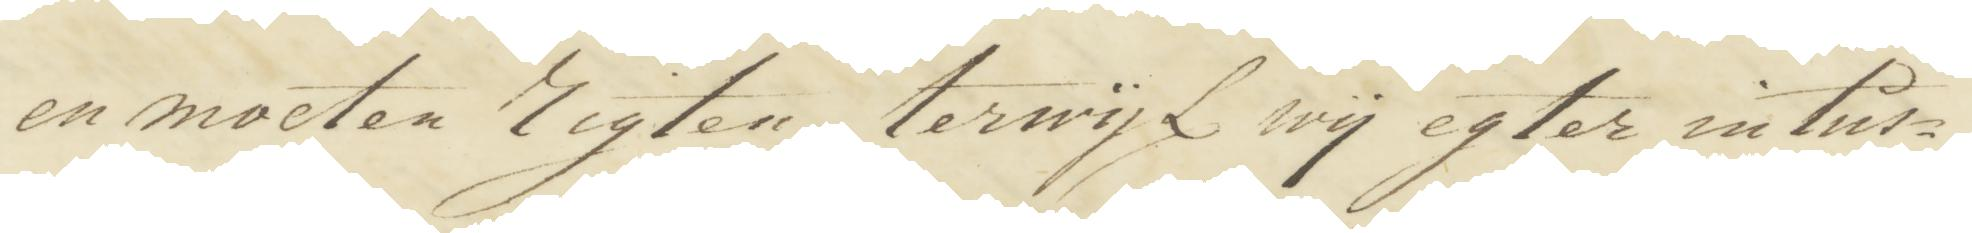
en moeten rigten, terwijl wij egter in tus=
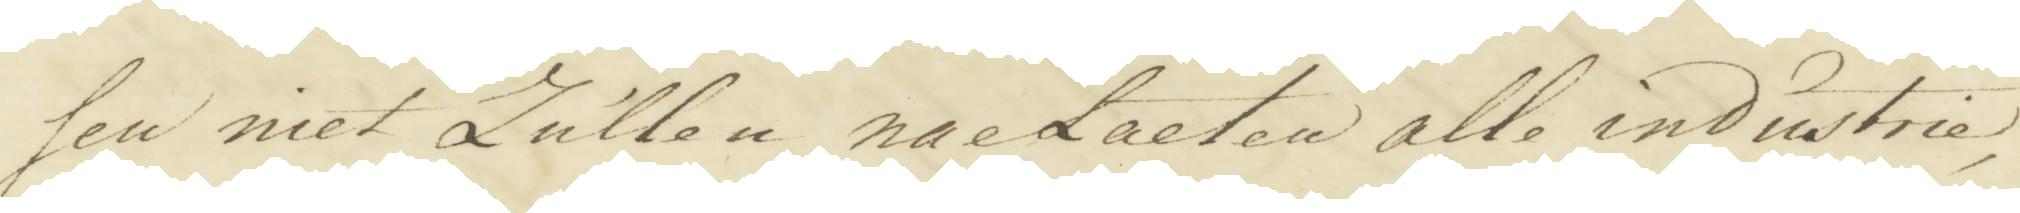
sen niet Zullen naelaeten alle industrie,
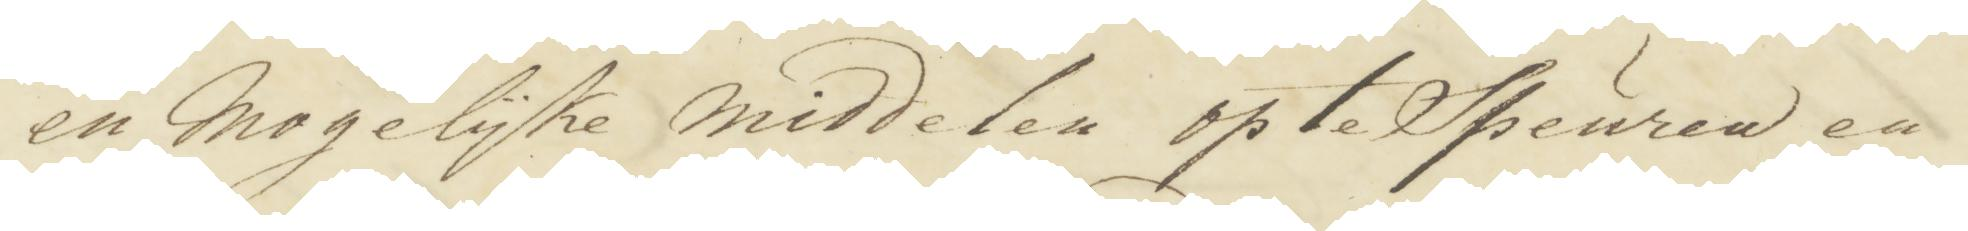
en mogelijke middelen op te speuren en
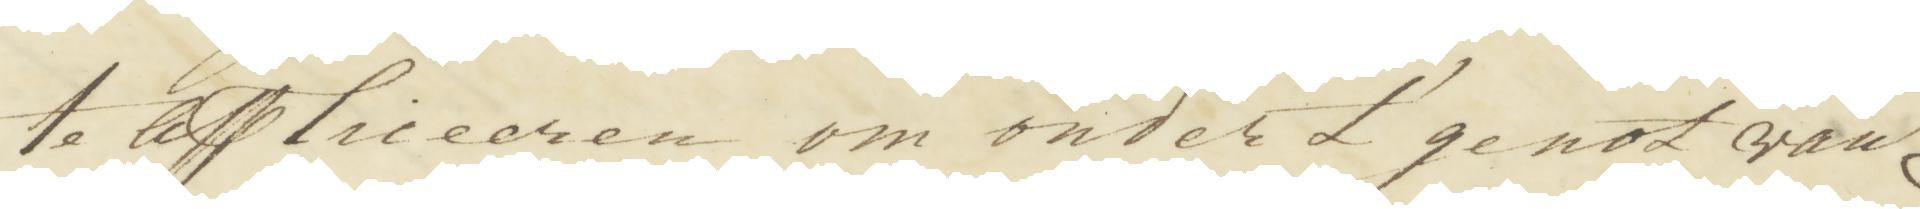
te appliceeren om onder t' genot van
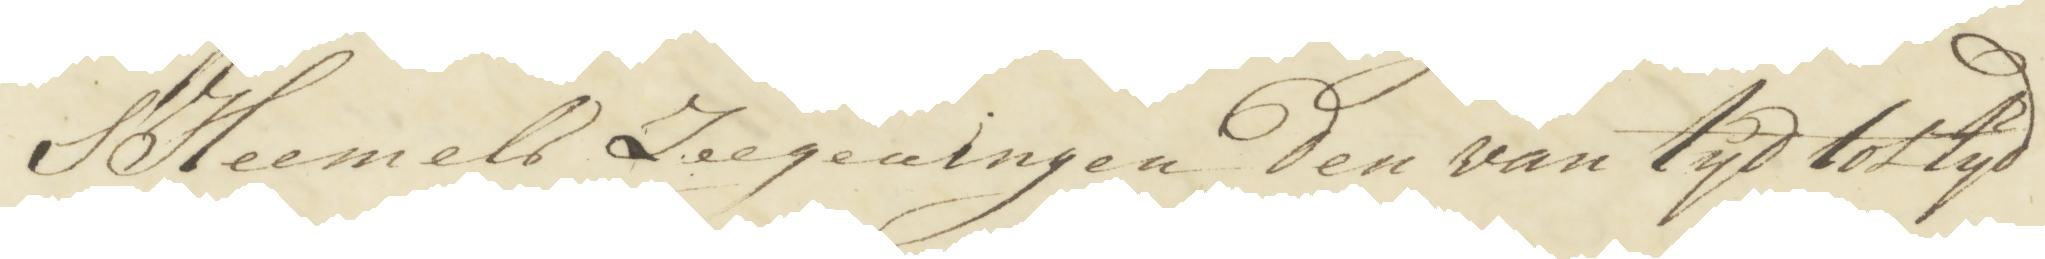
s' Hemels Zeegeningen den van tijd tot tijd
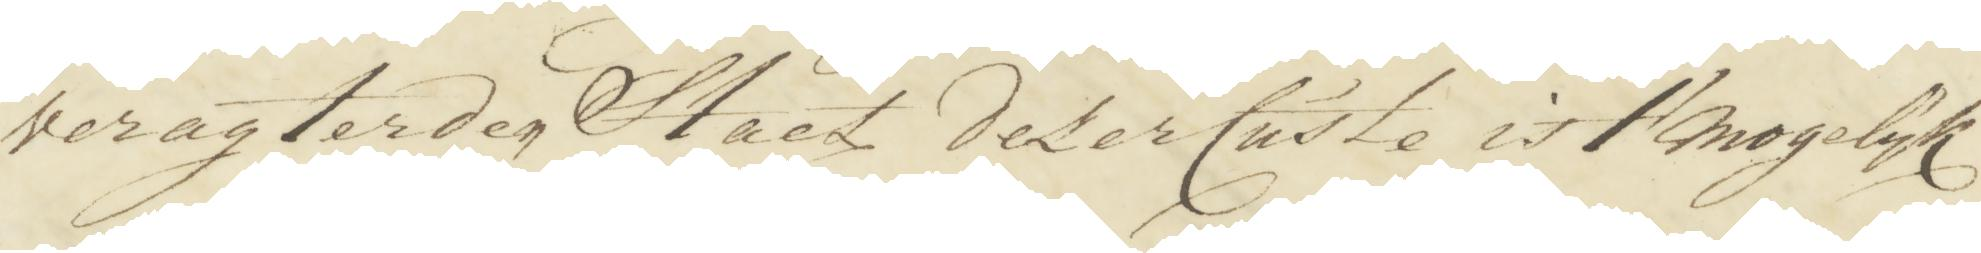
veragterden staet dezer Custe is t' mogelijk
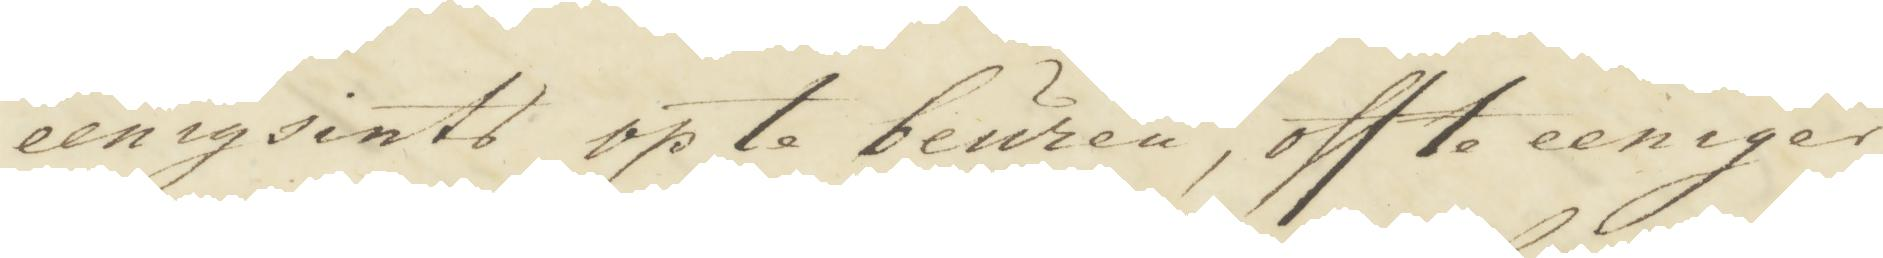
eenigsints op te beuren, off te eeniger
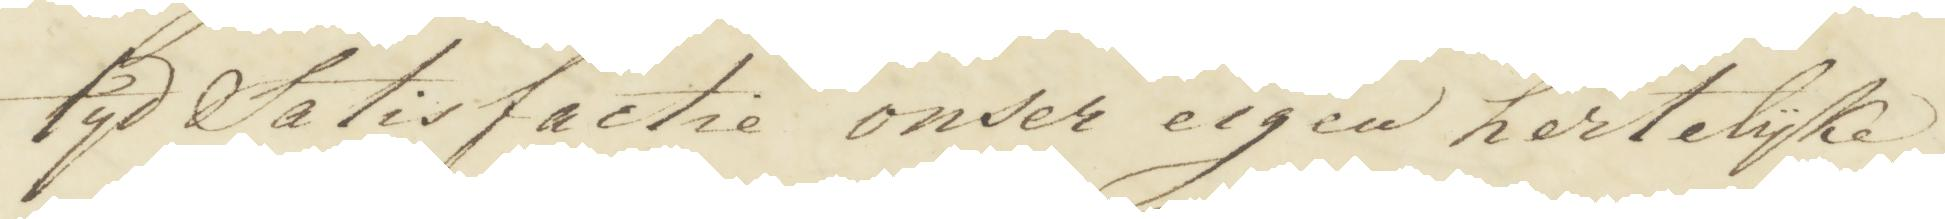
tijd Satisfactie onser eigen hertelijke
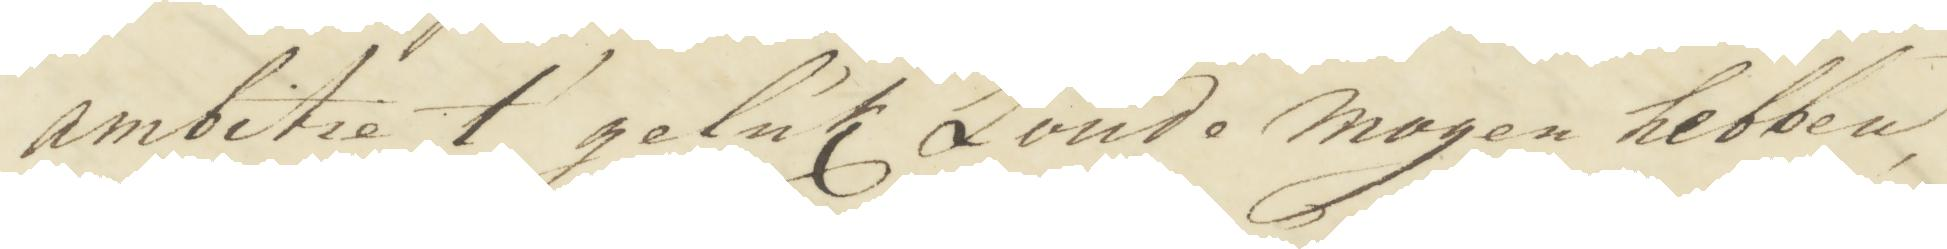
ambitie t' geluk Zoude mogen hebben,
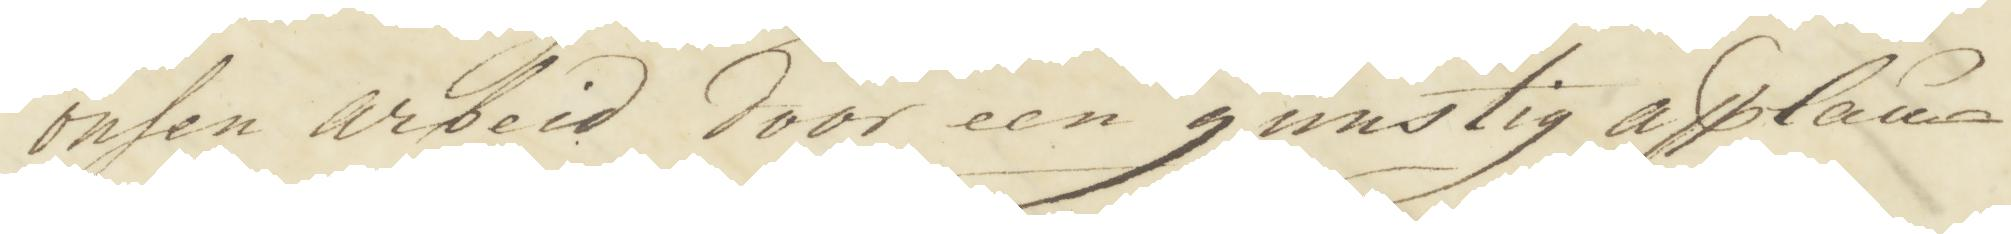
onsen arbeid door een gunstig applau=
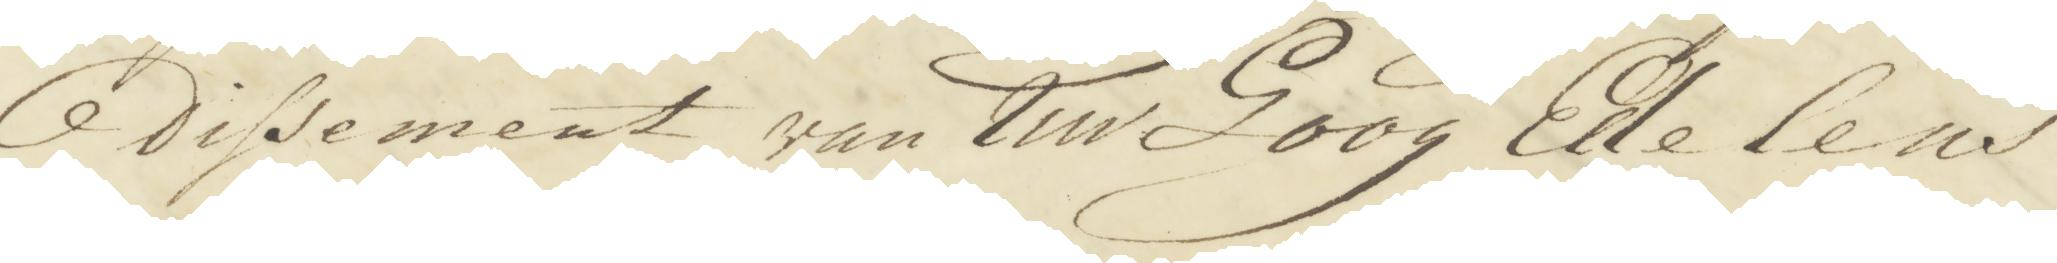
dissement van uw Hoog Edelens
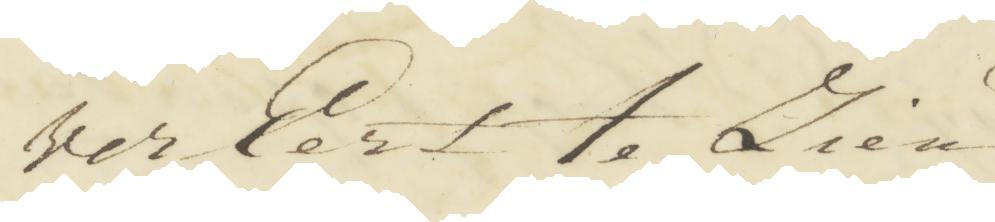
ver Eert te Zien.
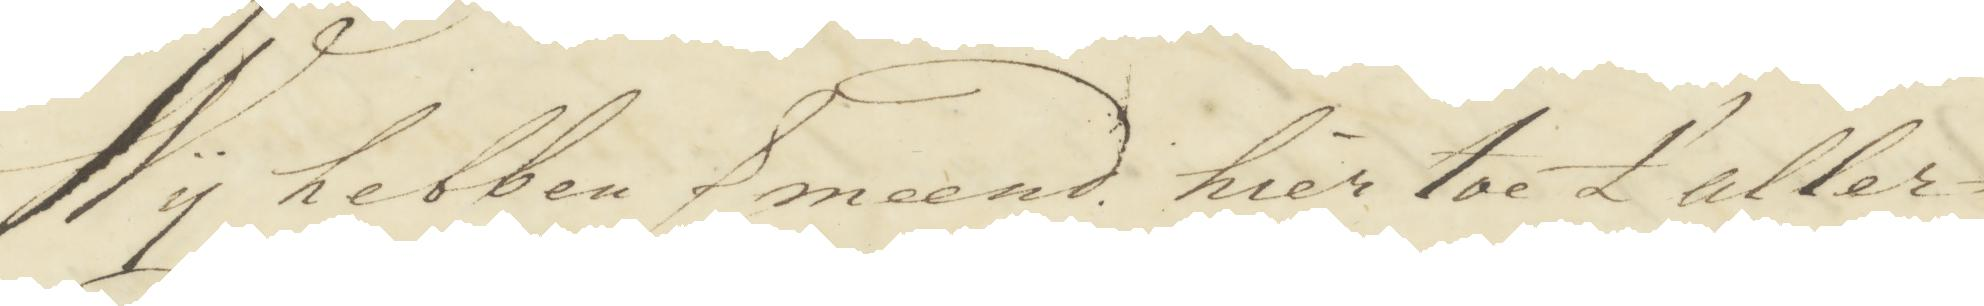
Wij hebben vermeend. hier toe t' aller=
